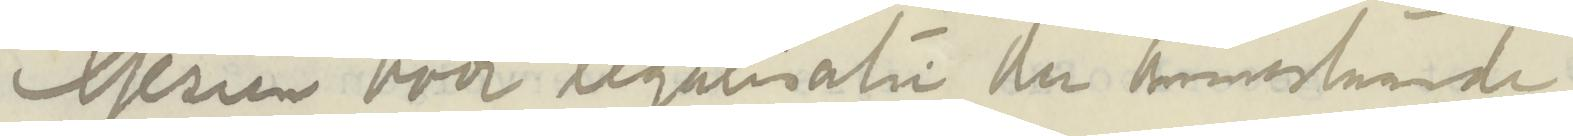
Gezien voor legalisatie der voorenstaande
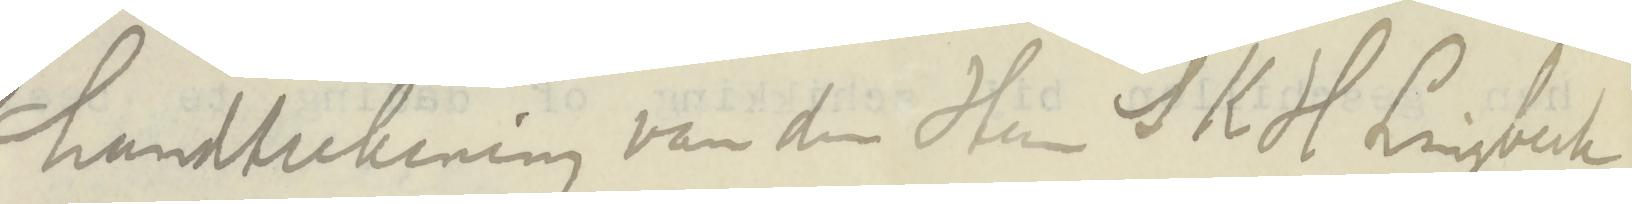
handteekining van den Heer S K H Luijbeck
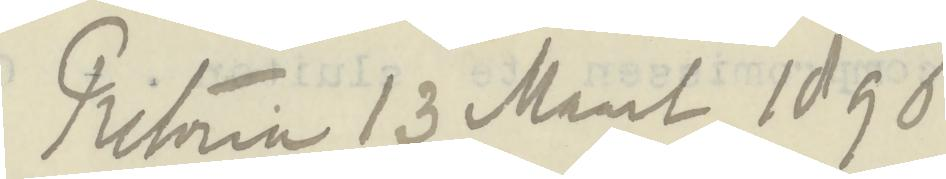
Pretoria 13 Maart 1896
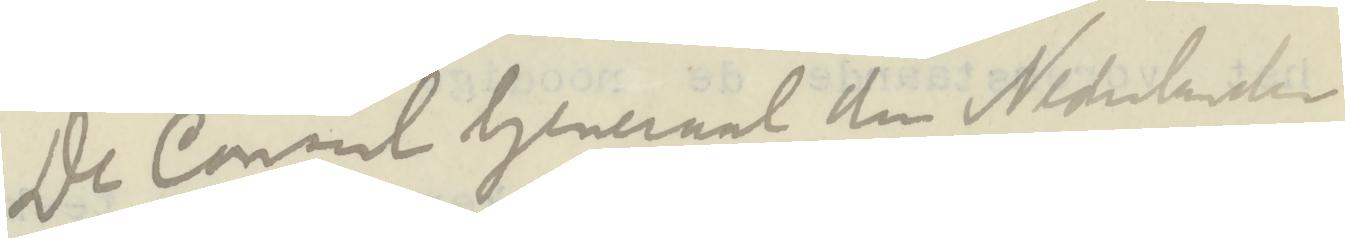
De Consul Generaal der Nederlanden
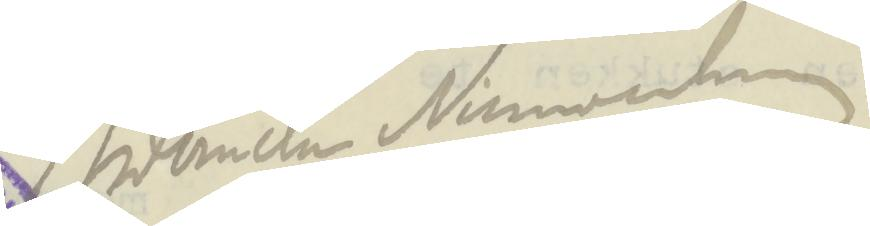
TJ van den Nieuwendam
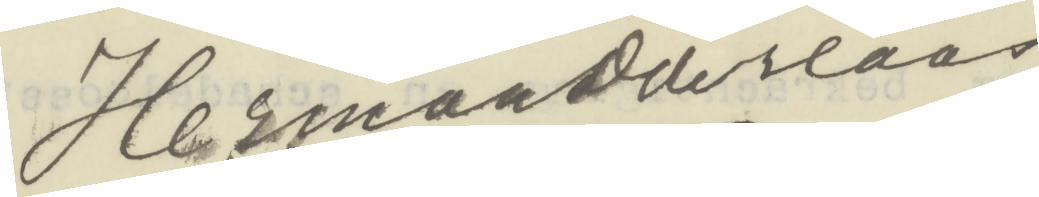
Herman v de Haas
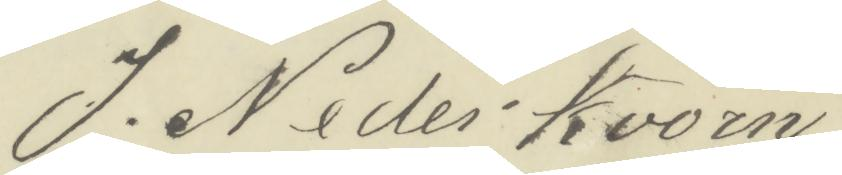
J. N e der Koorn
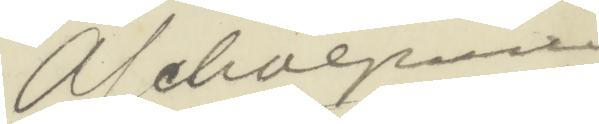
A schaepman
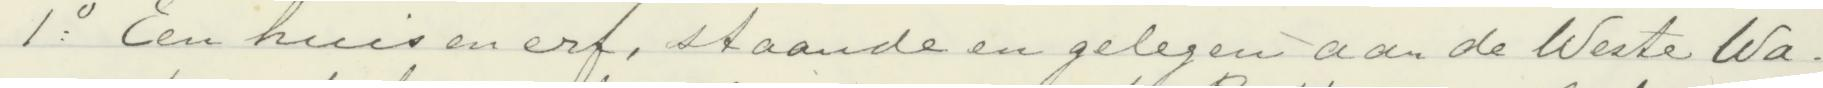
1:o Een huis en erf, staande en gelegen aan de Weste Wa
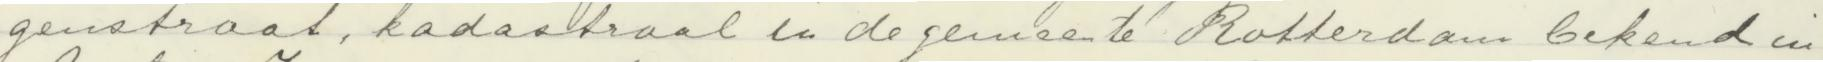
genstraat, kadastraal in de gemeente Rotterdam bekend in
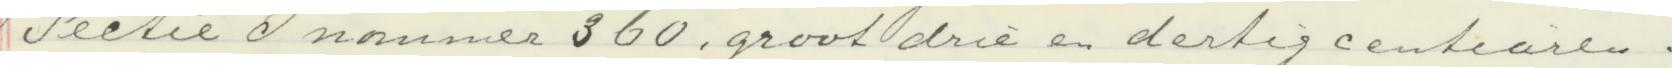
sectie J nommer 360, groot drie en dertig centiaren
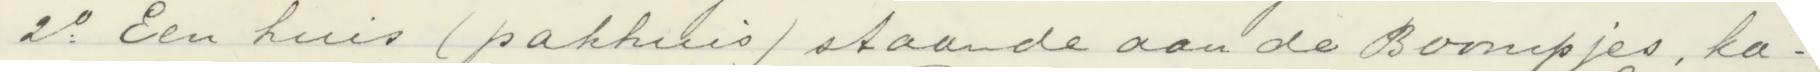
2:o Een huis (pakhuis) staande aan de Boompjes, ka -
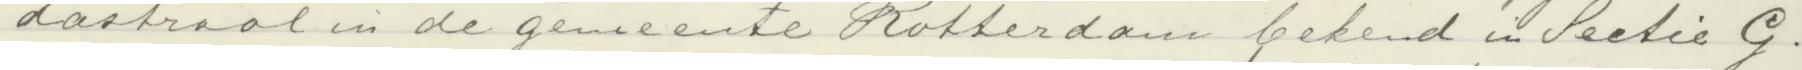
dastraal in de gemeente Rotterdam bekend in sectie G
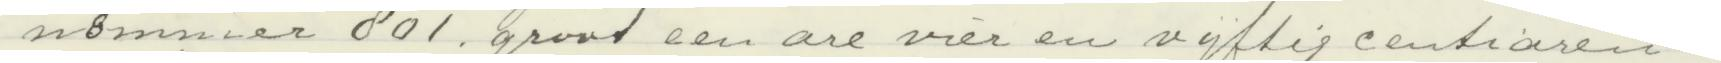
nommer 801. groot een are vier en vijftig centiaren.
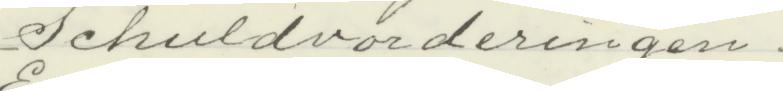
Schuldvorderingen.
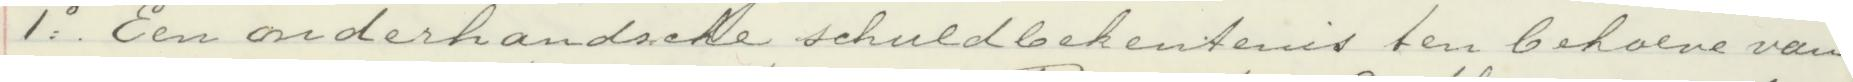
1:o. Een onderhandsche schuldbekentenis ten behoeve van
